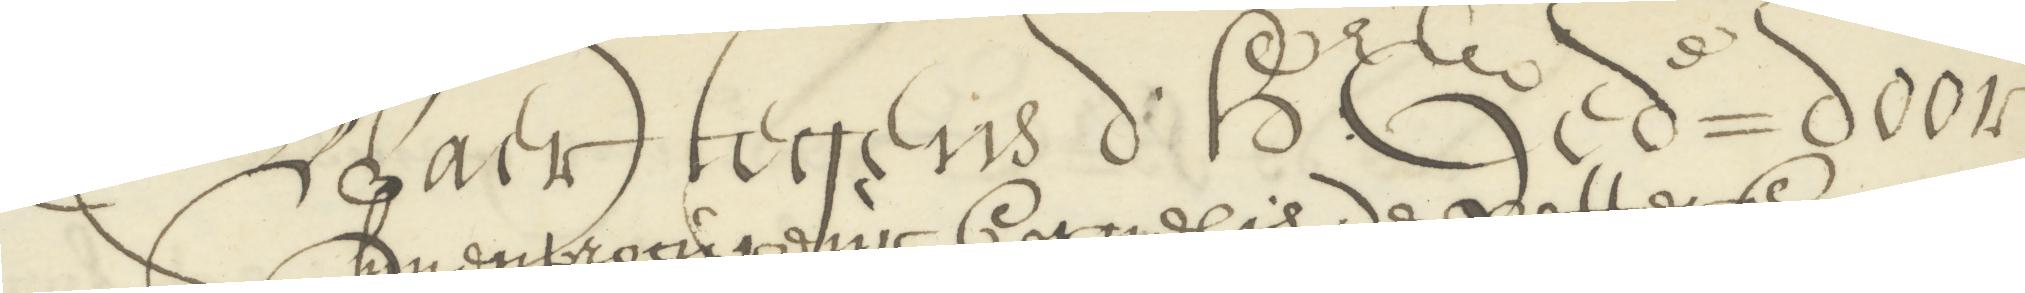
Waer tegens d' H:r Ged=e door
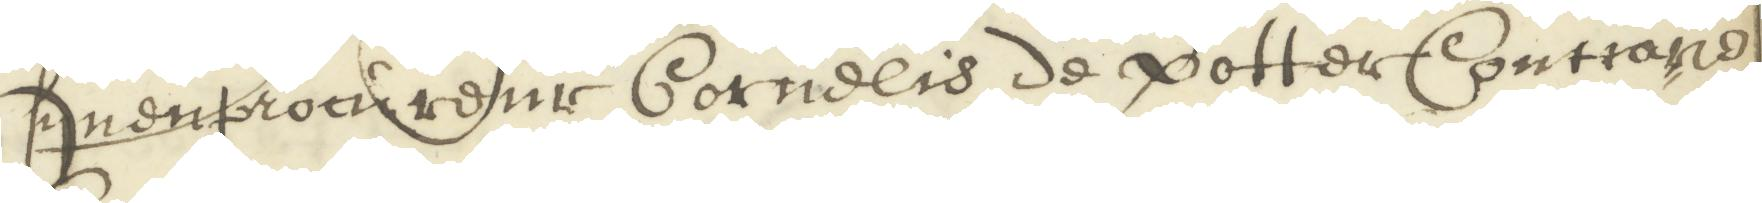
synen procureur Cornelis de potter Contrarie
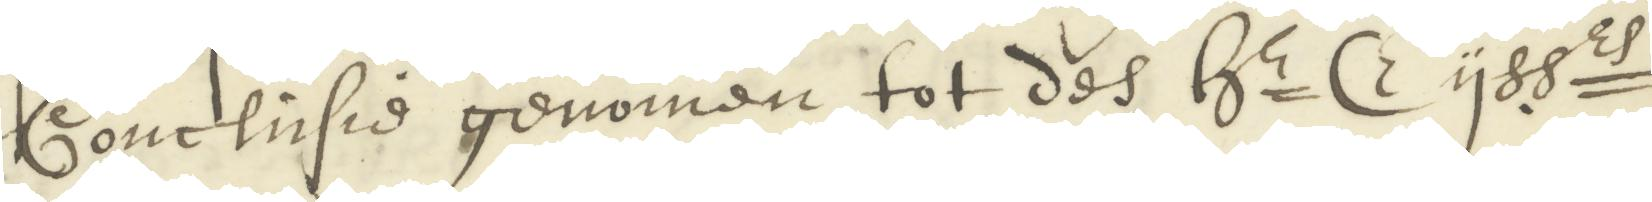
Conclusie genomen tot des H=r Eijss=rs
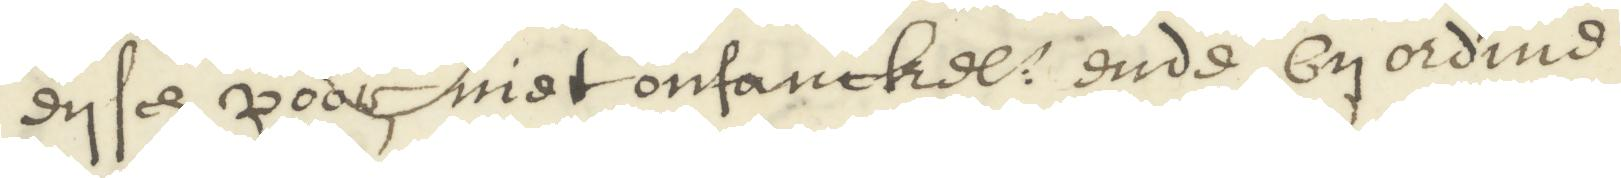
eysch voor niet onfanckelijk ende by ordine
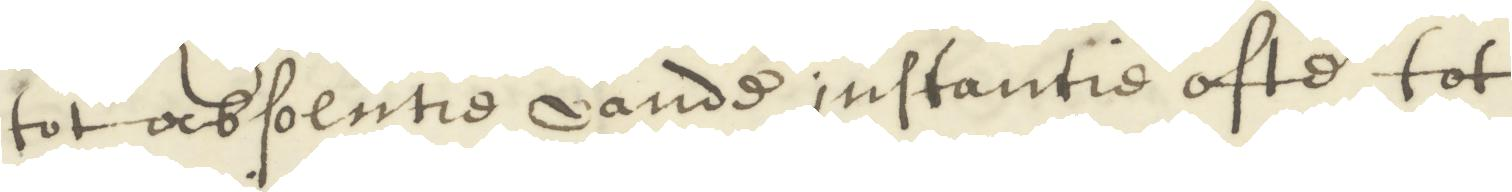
tot absolutie vande jnstantie ofte tot
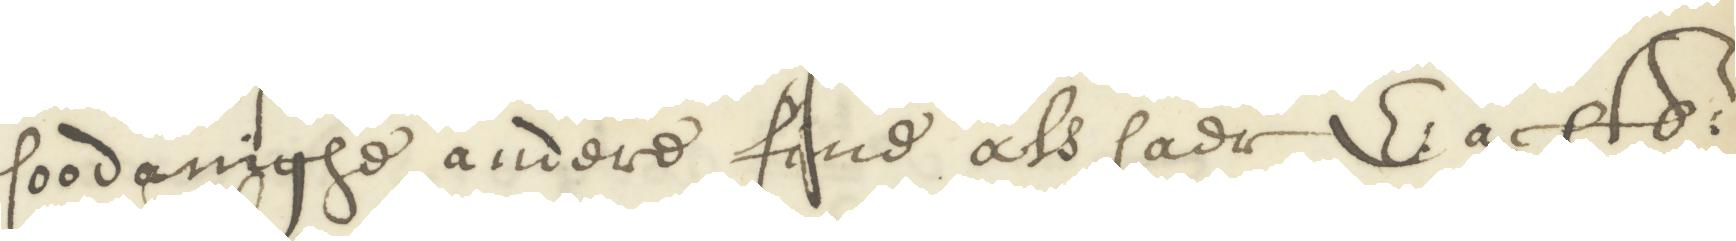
soodanighe andere fine als haer E: achtb:
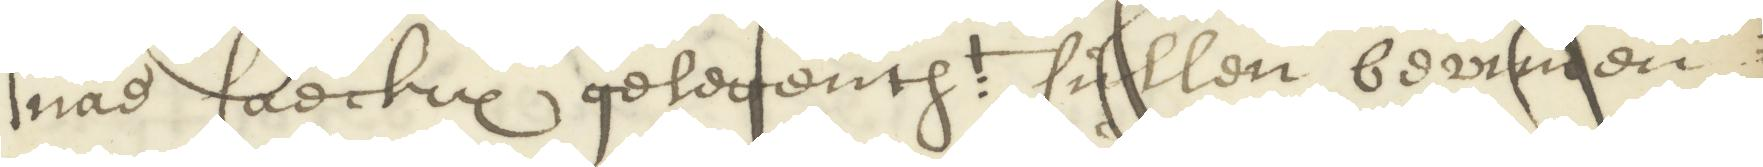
nae saeckx gelegenth:t sullen bevinden
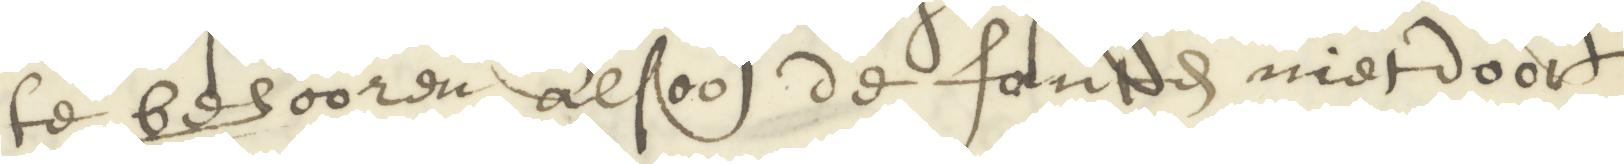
te behooren, alsoo de fauten niet door
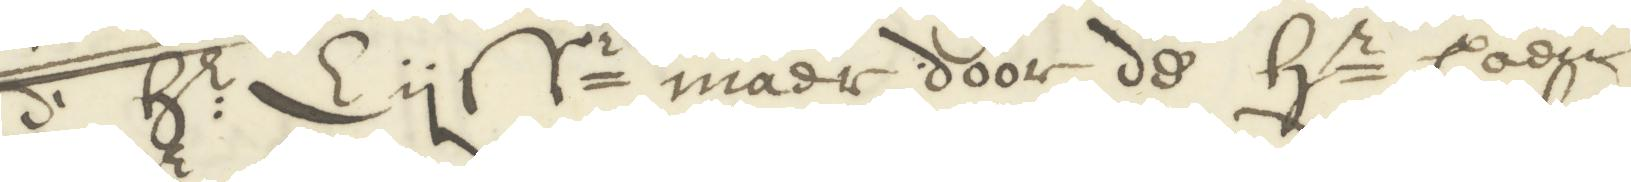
d' H:r Eijss=r maer door de H=r Coen
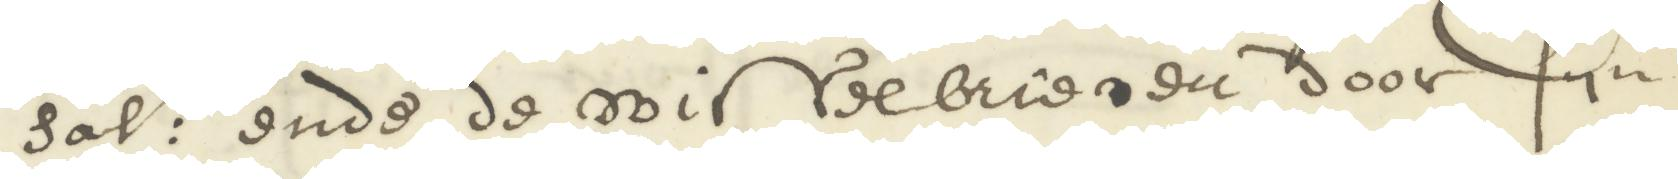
sal:r ende de wisselbrieven door syn
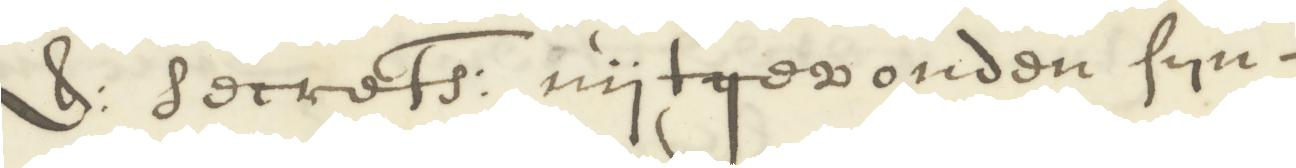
E: secrets: uijtgevonden syn
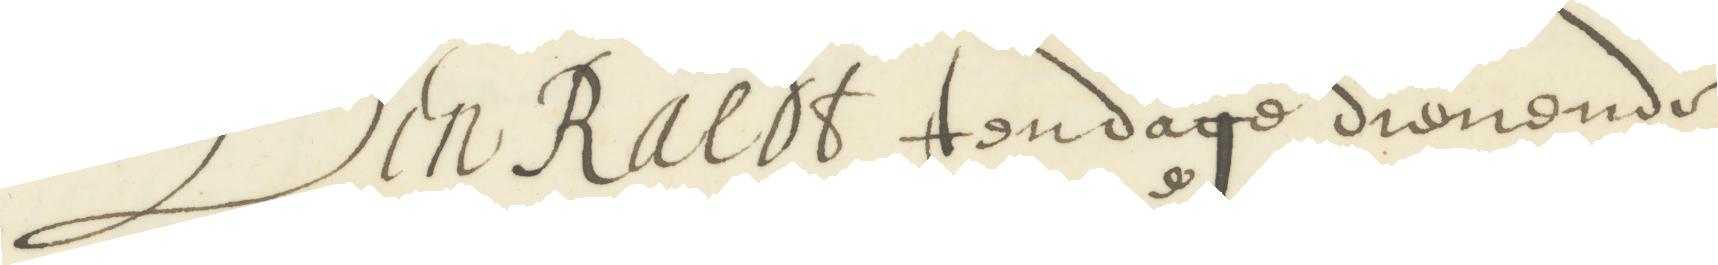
Den Raedt ten dage dienende
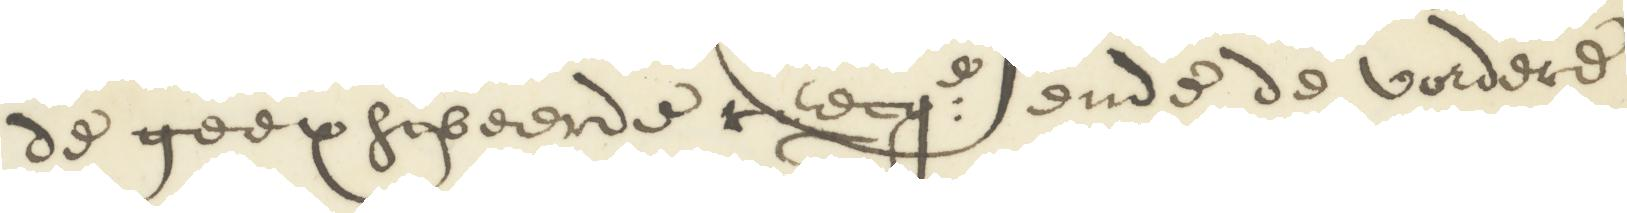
de geexhibeerde reecq:e ende de verdere
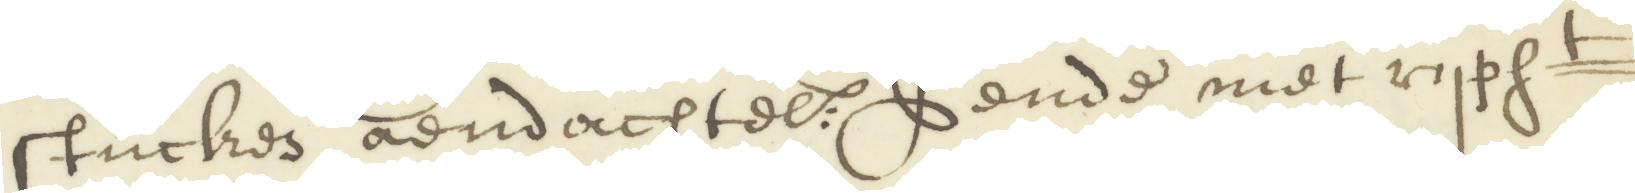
stucken aendachtelijk ende met ryph=t
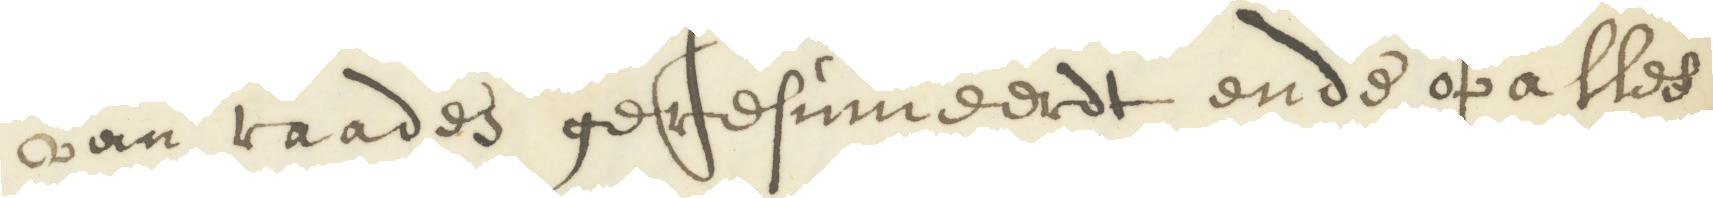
van raades geresumeerdt ende op alles
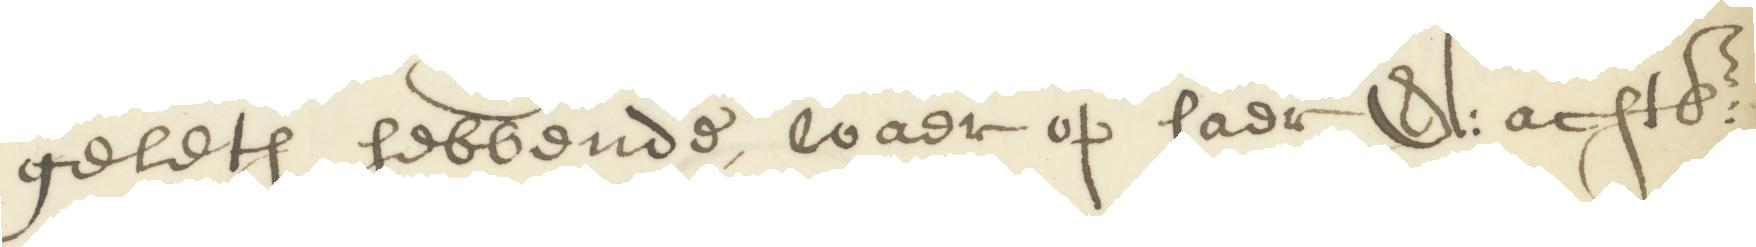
geleth hebbende, waer op haer E: achtb:
